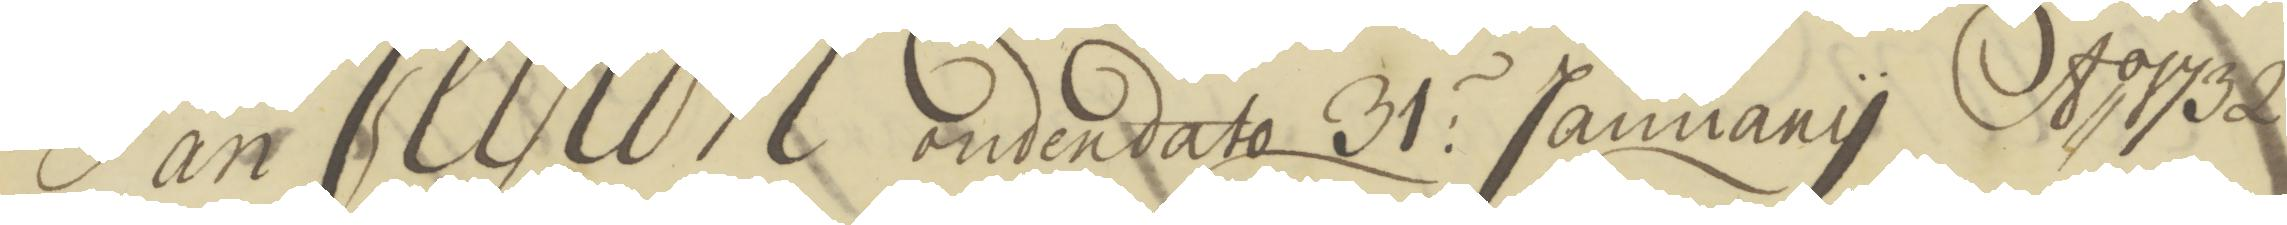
Van Ceijlon onder dato 31: Januarij A„o 1732
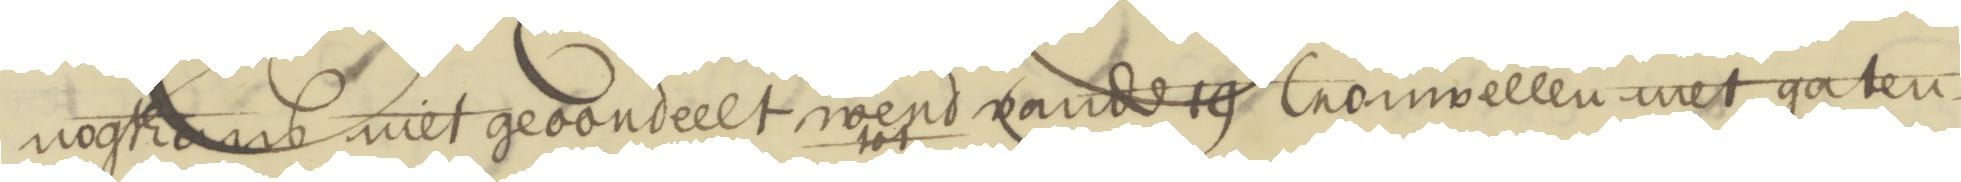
nogthans niet geoordeelt werd van de 19 tromvellen met gaten
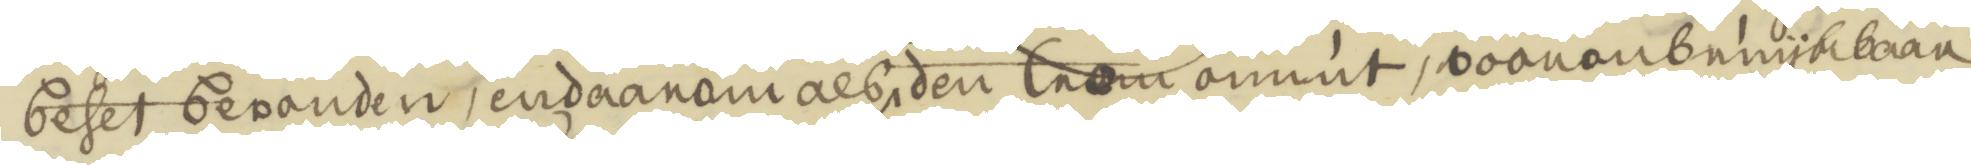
beset bevonden, en daarom als ^ den trom onnut, voor onbruijkbaar
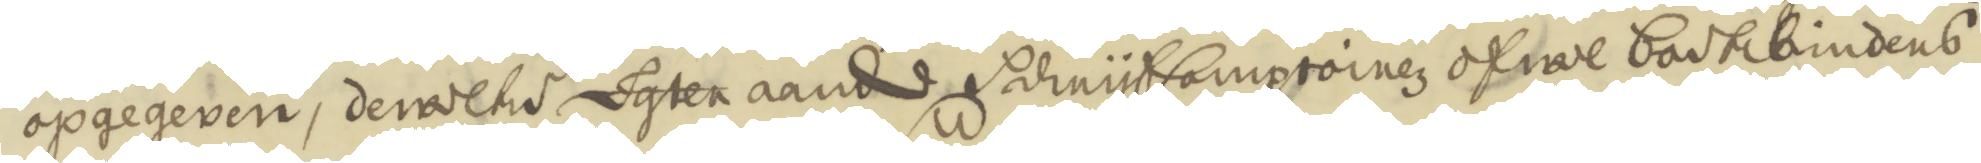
opgegeven, dewelke Egter aande Schrijf Comptoiren of wel boekbinders
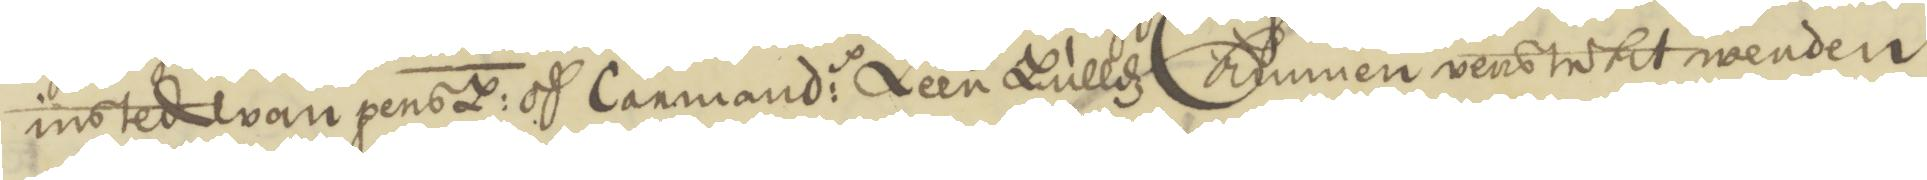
instede van persz: of Cormand:s Leer zullen kunnen verstrekt werden
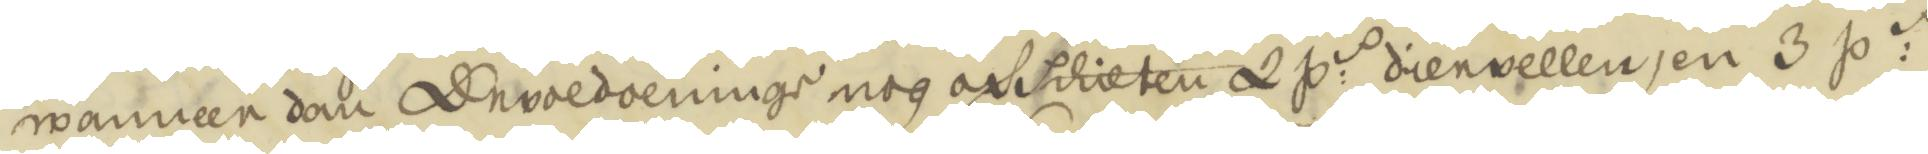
wanneer dan ter voldoeninge nog overschieten 2 p:r dier vellen, en 3 p:s
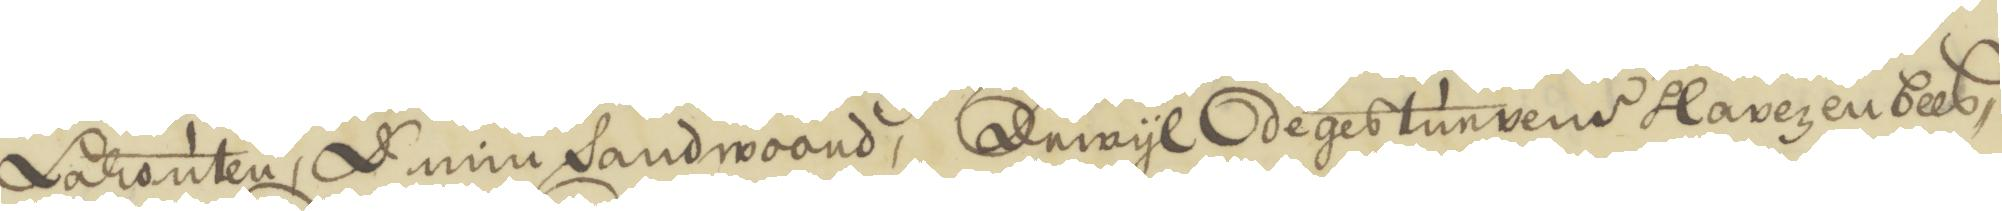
Lahouten, te min verandwoord, Terwijl de gesturvene slaven en bees,
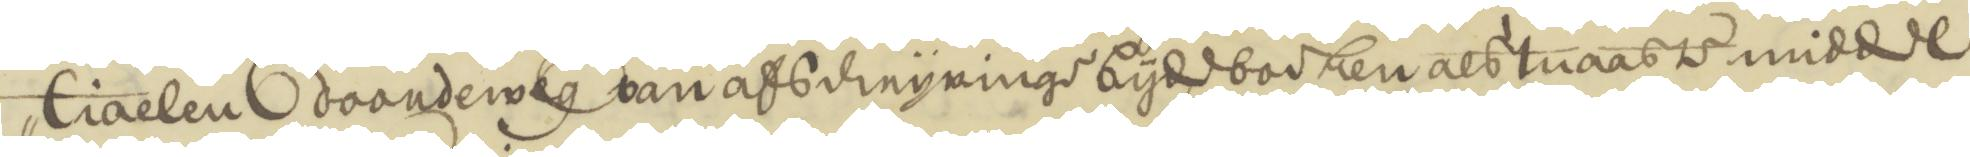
„tiaelen door deweg van afschrijvinge bijde boeken als 'tnaaste middel
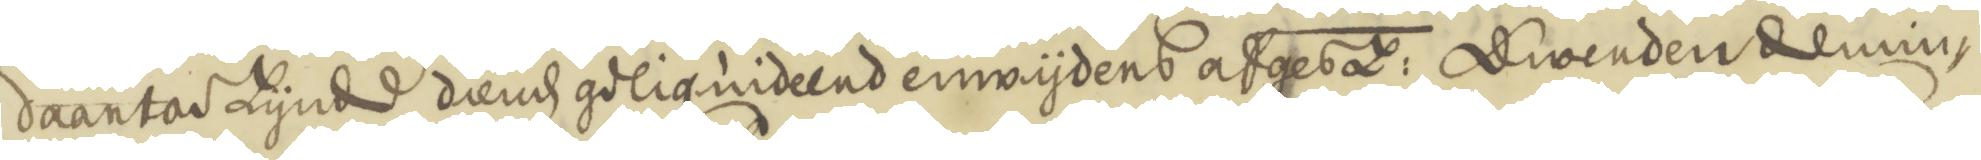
daartoe Zijnde dienen geliquideerd en wijders afgesz: te werden de min„
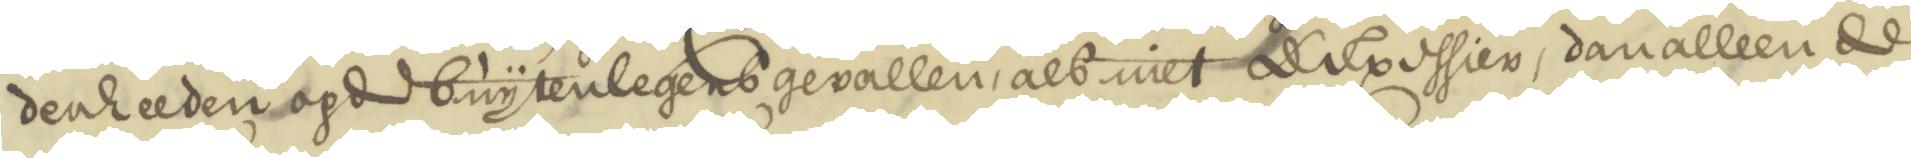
derheeden op de buijtenlegers gevallen, als niet te Exessier, dan alleen de
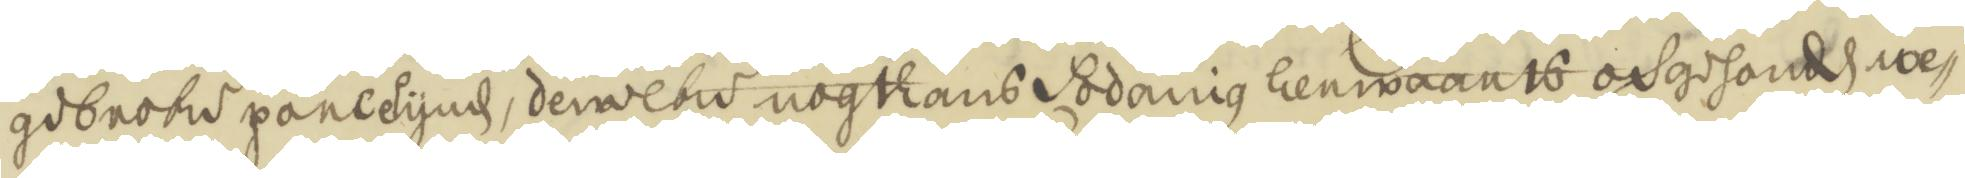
gebroke porcelijnen, dewelke nogthans Sodanig herwaarts overgesonden we„
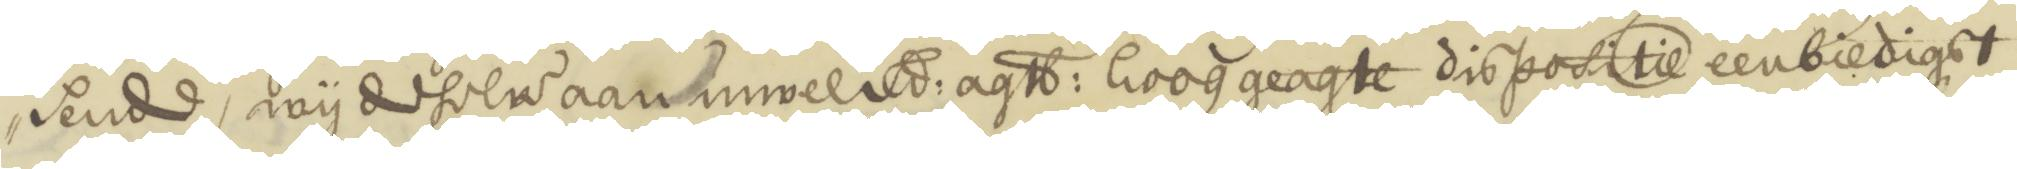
„Sende, wij deselve aan uwel Ed: agtb: hoog geagte dispositie eerbiedigst
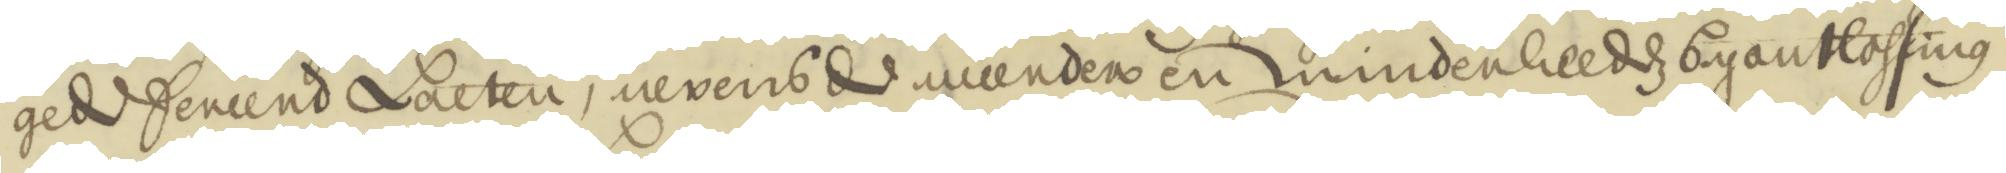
gedefereerd Laeten, nevens de meerder en minderheeden by ontlossing
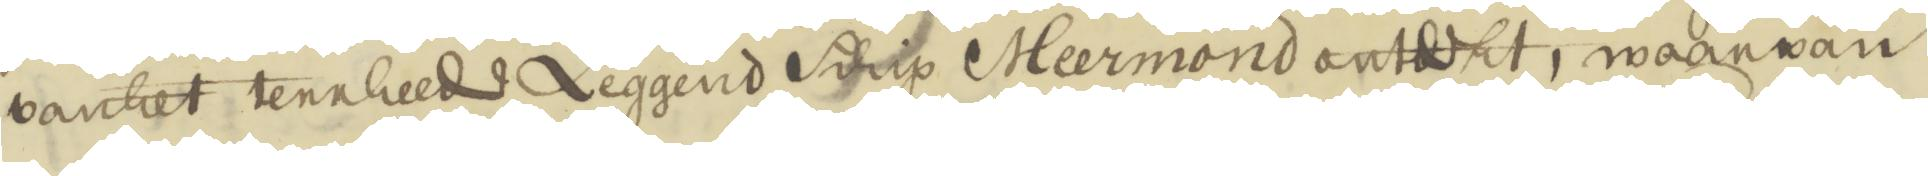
van het ter rheede Leggend schip Meermond ontdekt, waarvan
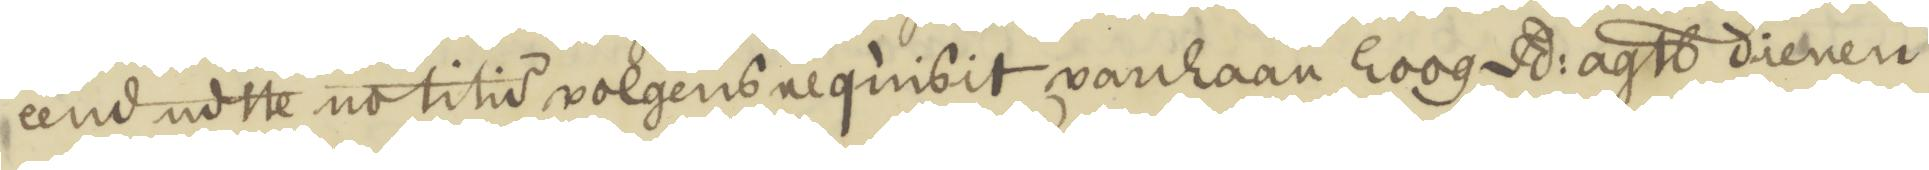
eene nette notitie volgens requisit van haar hoog Ed: agtb dienen
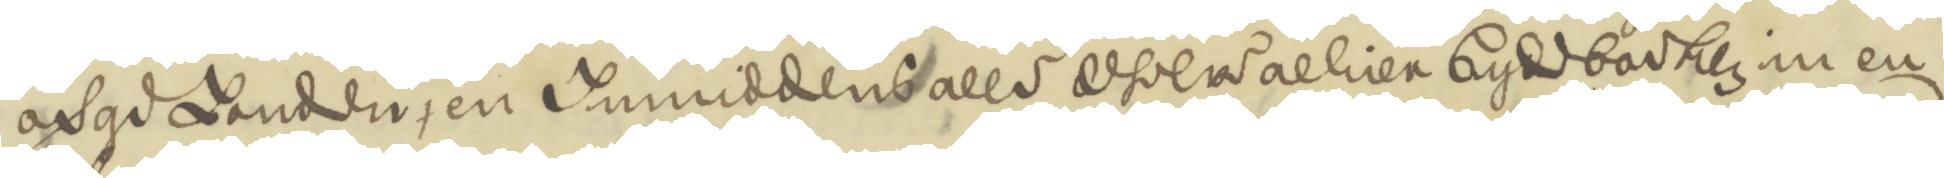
overgezonden, en Inmiddens alle deselve alhier by de boeken in en
